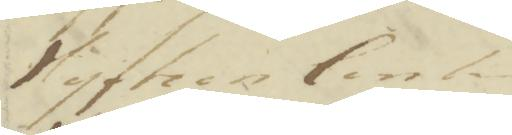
Vyftien Cents
